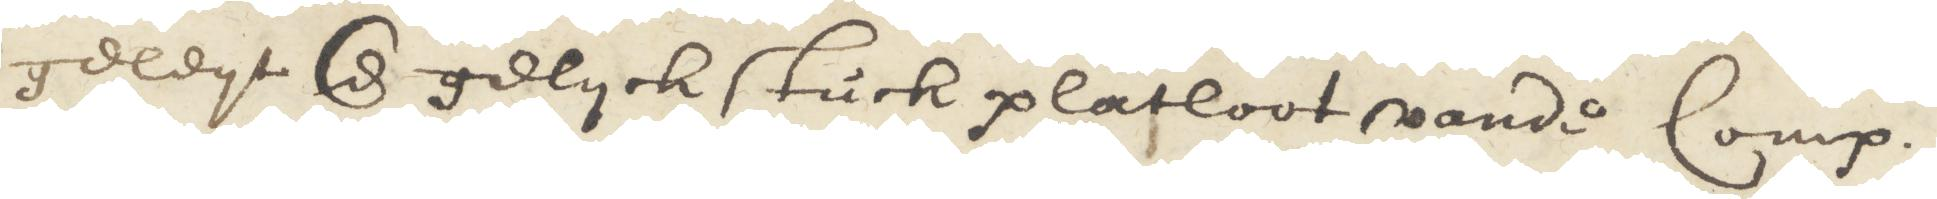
geleyt ende gelyck stuck platloot vande Comp.e
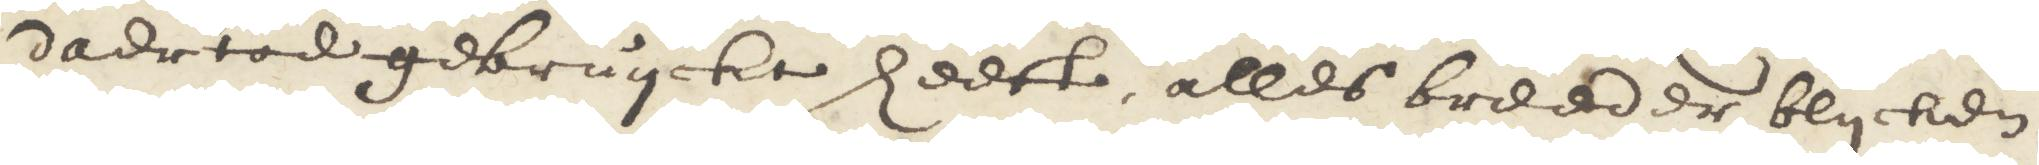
daer toe gebruyckt heeft, alles breeder blycken
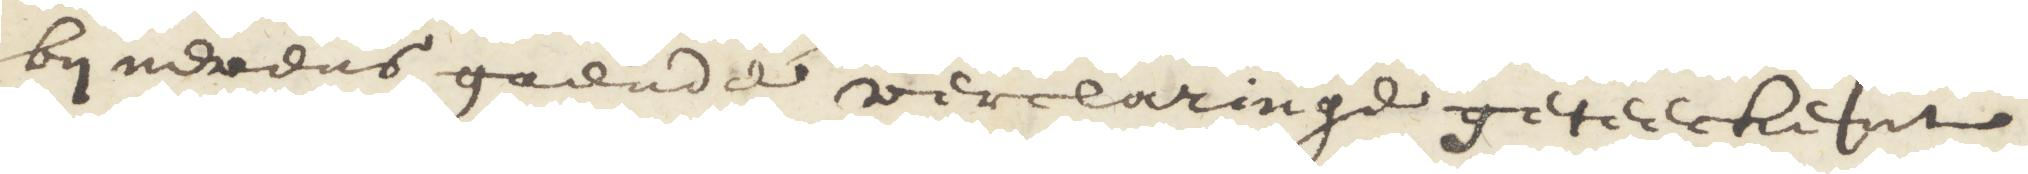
by nevens gaende verclaringe geteeckent
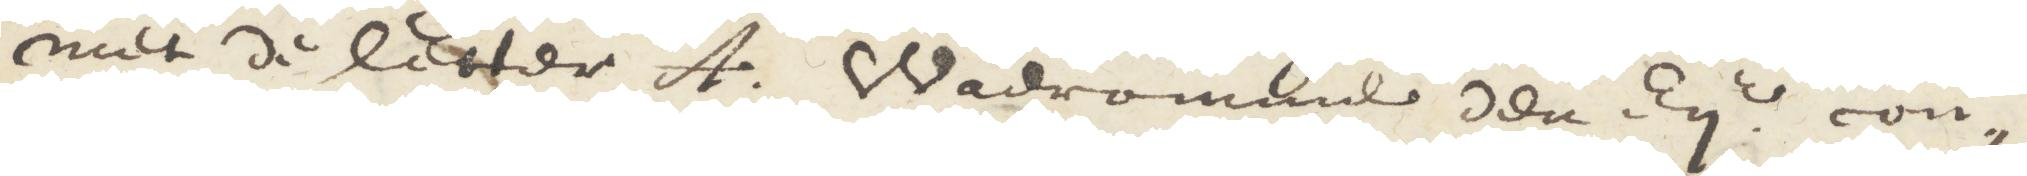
met de letter A. Waeromme den Ey.r con„
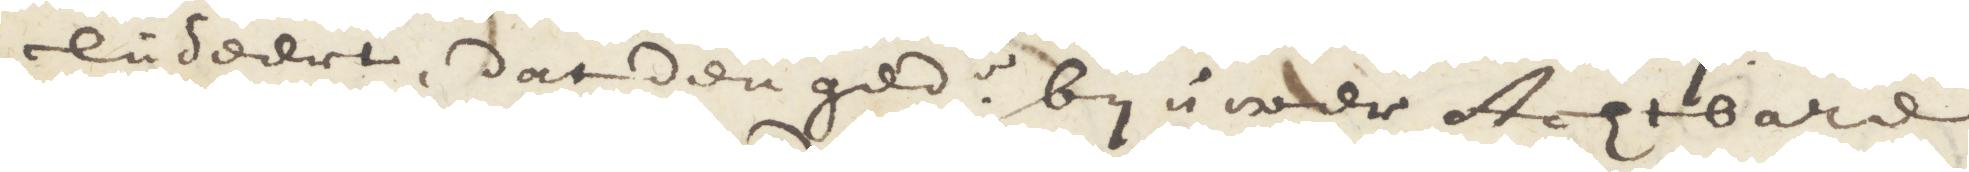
cludeert, dat den ged.e by uwer Achtbare
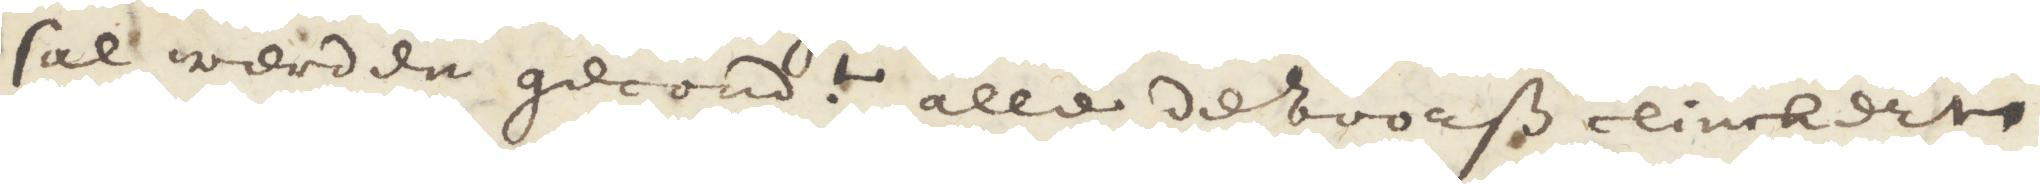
sal werden gecond.t alle de voorꞵ clinckerts
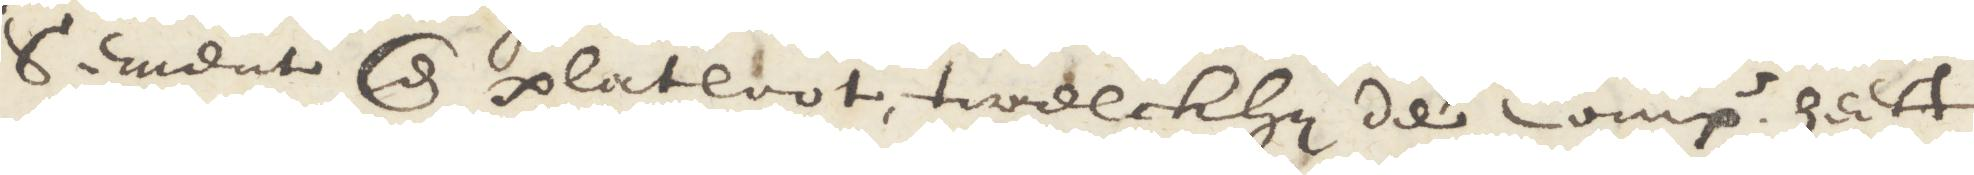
Sement ende platloot, twelck hy de Comp:e heeft
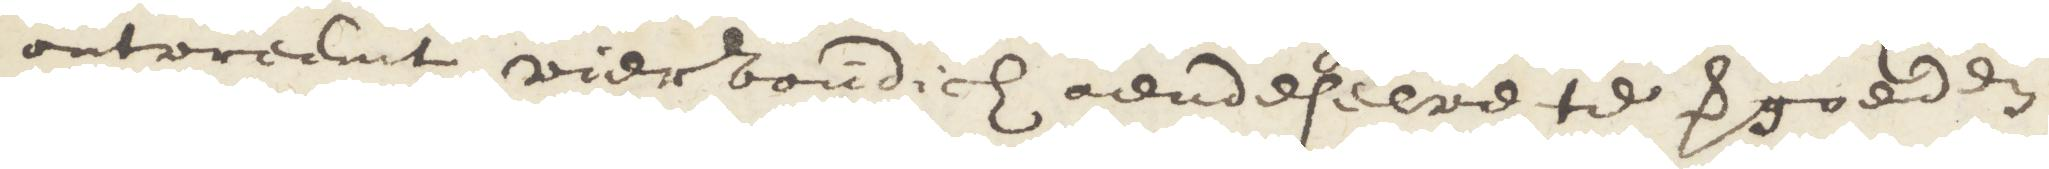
ontvreemt vier voudich aendeselve te vergoeden
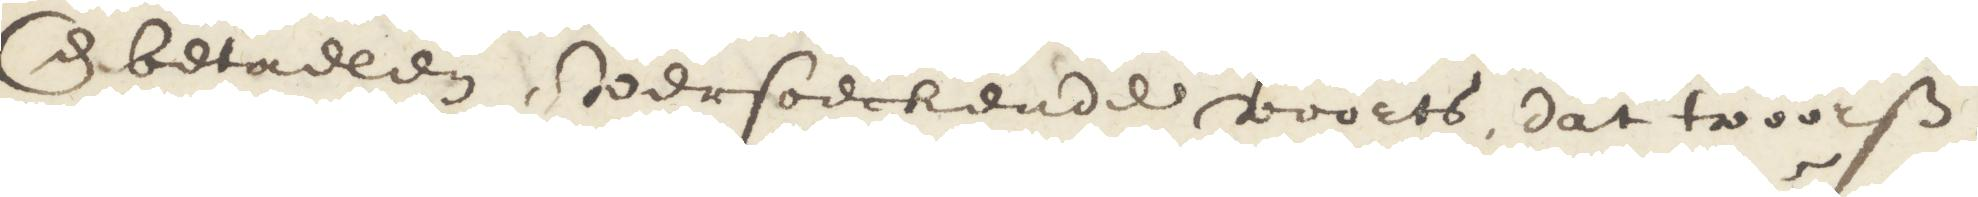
ende betaelen, versoeckende voorts, dat tvoorꞵ
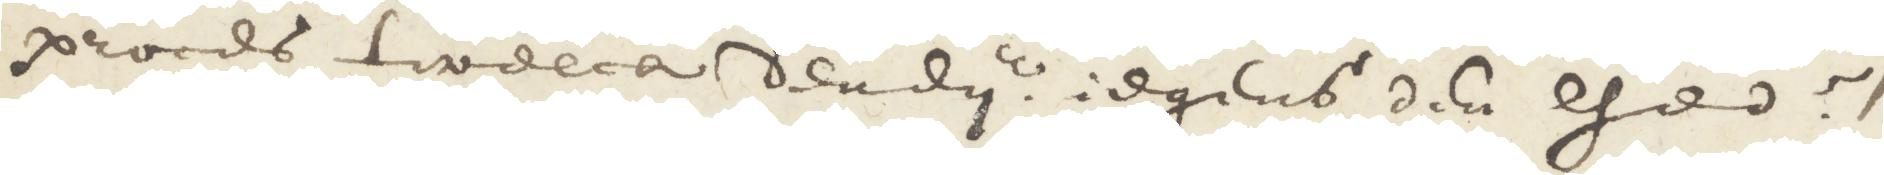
proces twelck den ey.r iegens den Ged.e
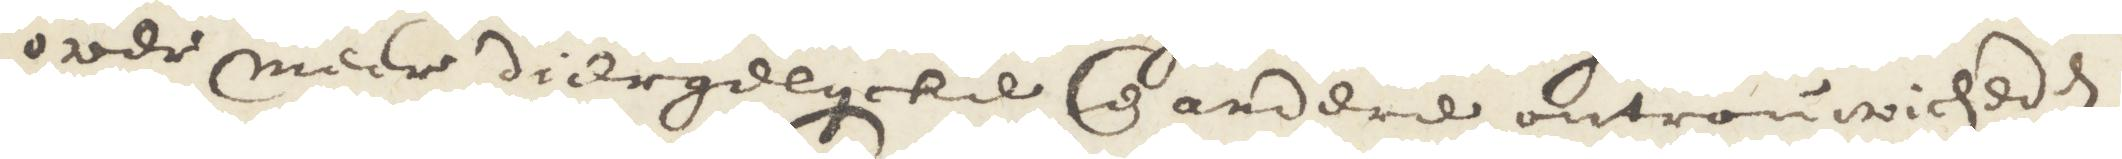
over meer diergelycke ende andere ontrouwicheden
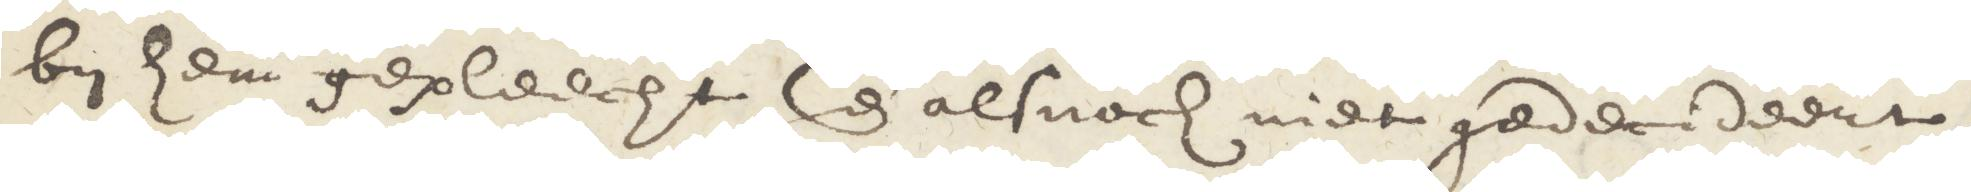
by hem gepleecht ende alsnoch niet gedecideert
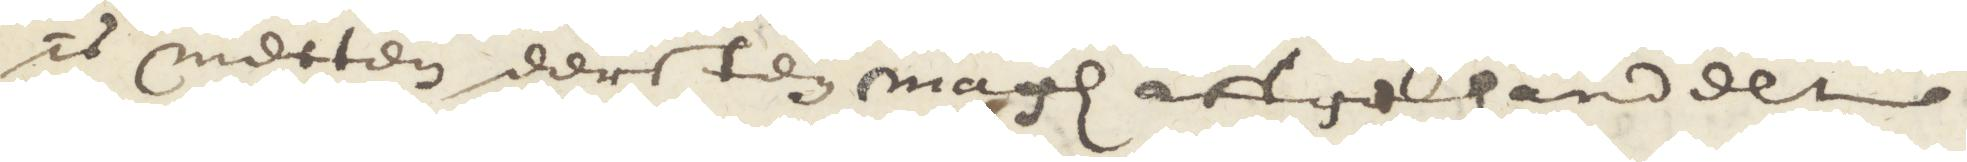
is metten eersten magh affgehandelt
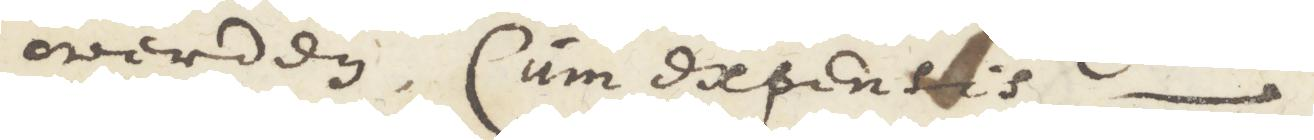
werden, Cum expensis —
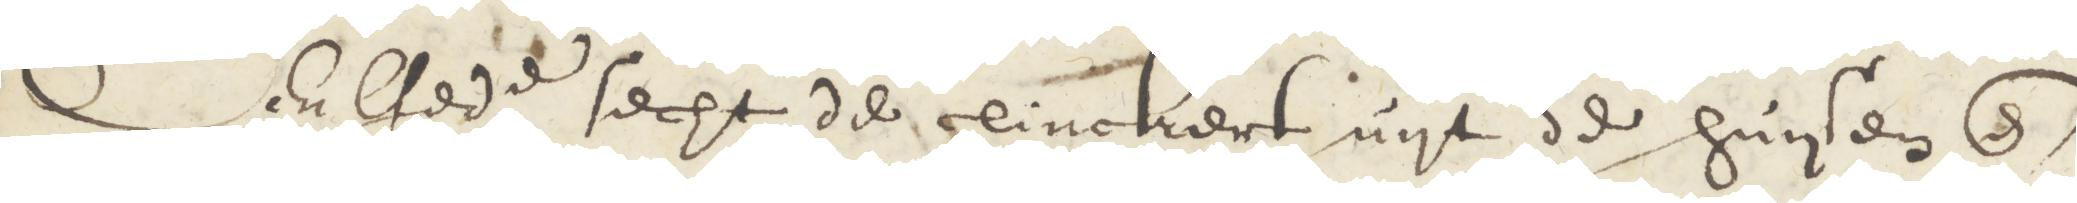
Den Ged.e secht de clinckert uyt de huysen ende
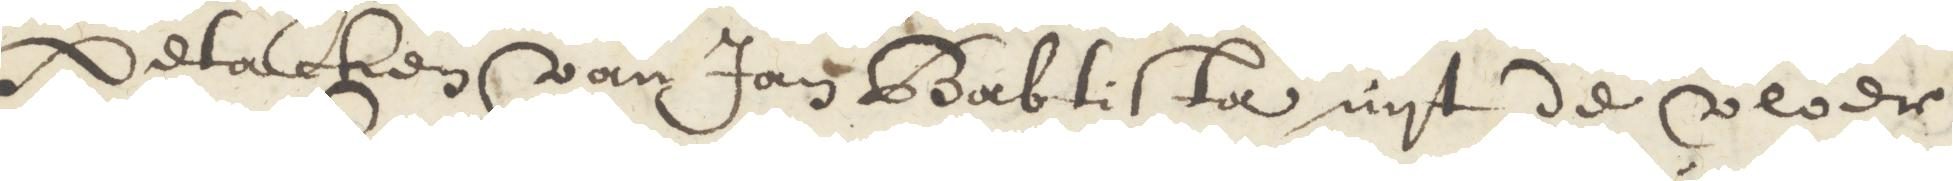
petachen van Jan Babtista uyt de vloer
